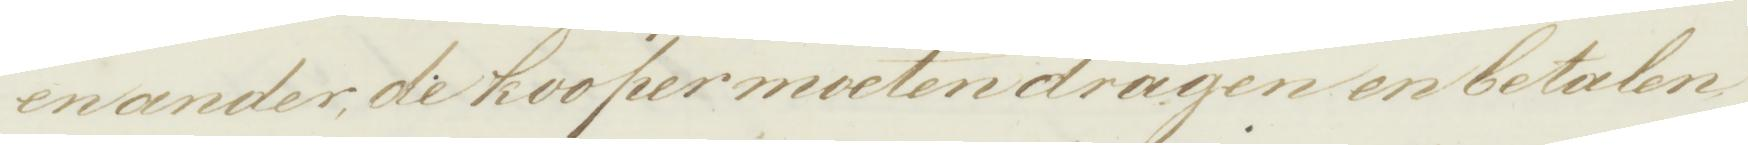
en ander, de kooper moeten dragen en betalen
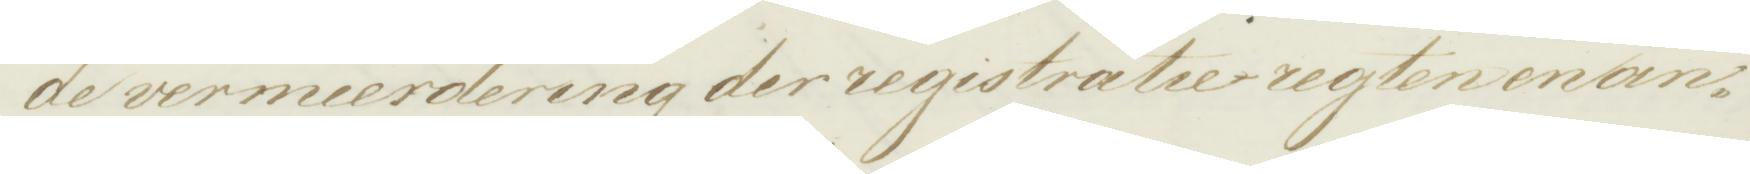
de vermeerdering der registratie-regten en an„
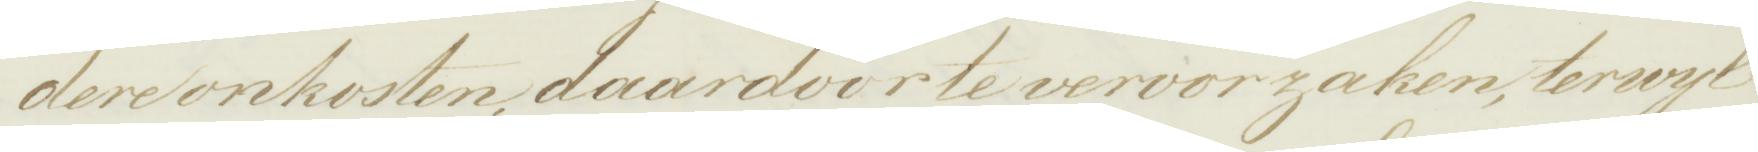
dere onkosten, daardoor te veroorzaken, terwyl
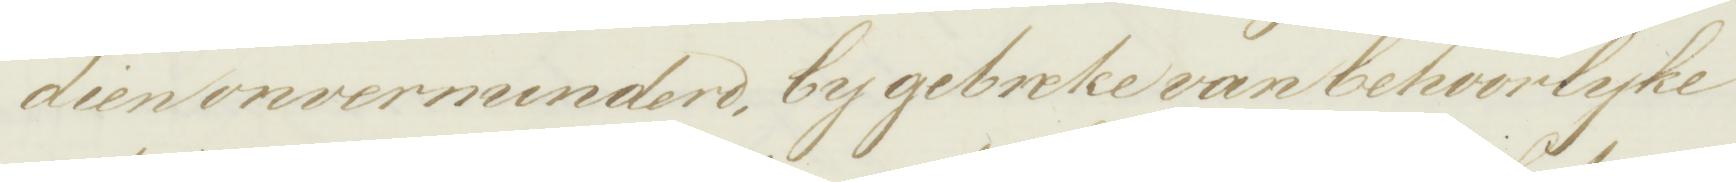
dien onverminderd, by gebreke van behoorlyke
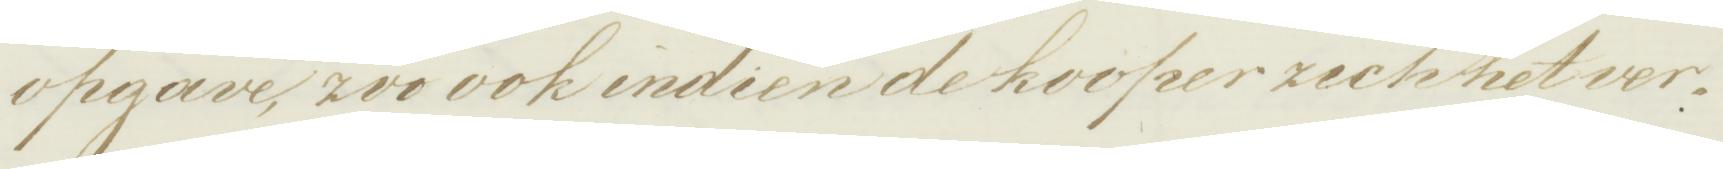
opgave, zoo ook indien de kooper zich het ver„
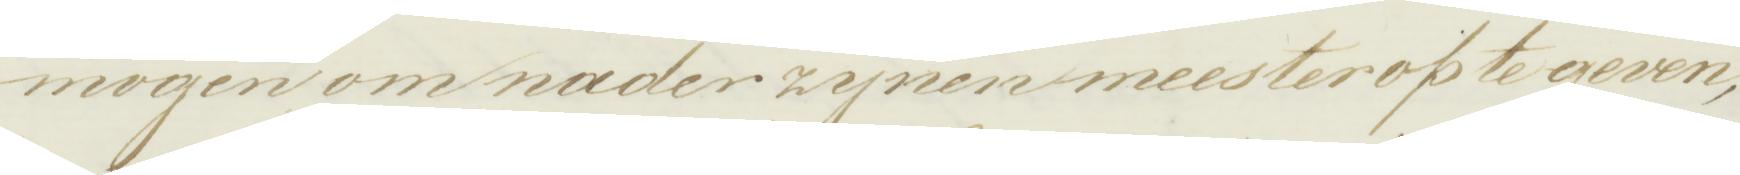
mogen om nader zynen meester op te geven,
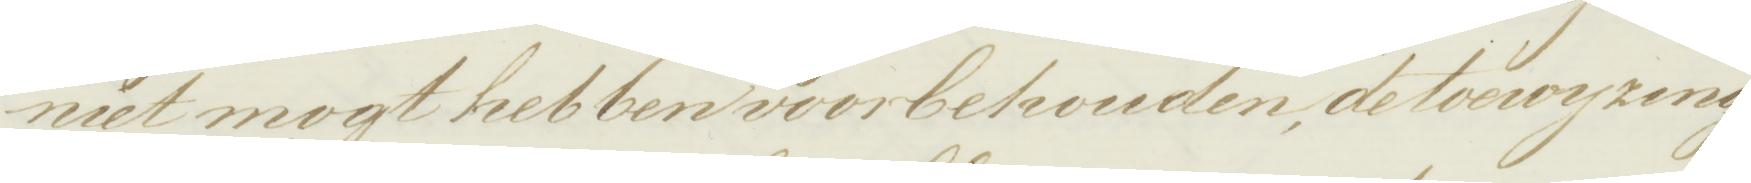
niet mogt hebben voorbehouden, de toewyzing
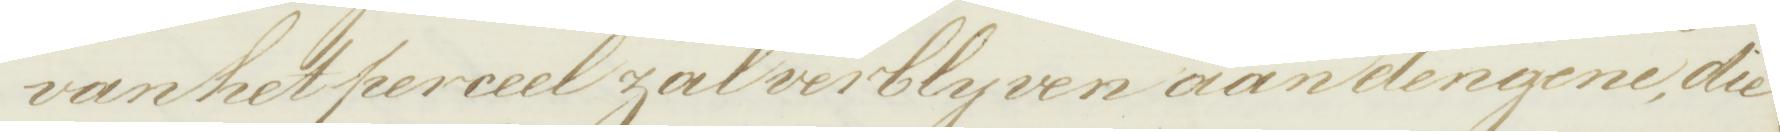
van het perceel zal verblyven aan dengene, die
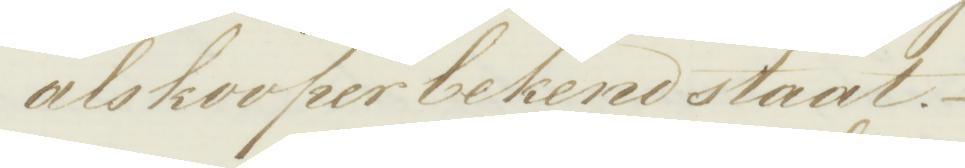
als kooper bekend staat.-
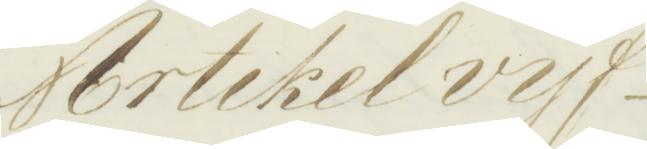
Artikel vyf-
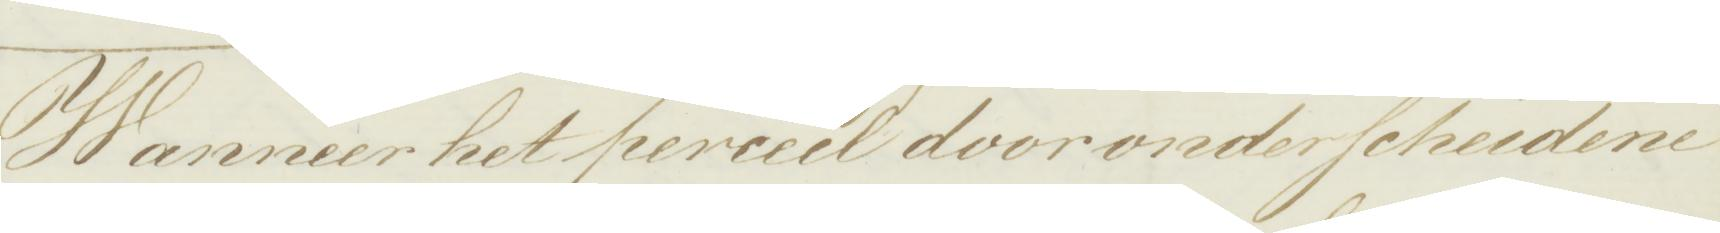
Wanneer het perceel door onderscheidene
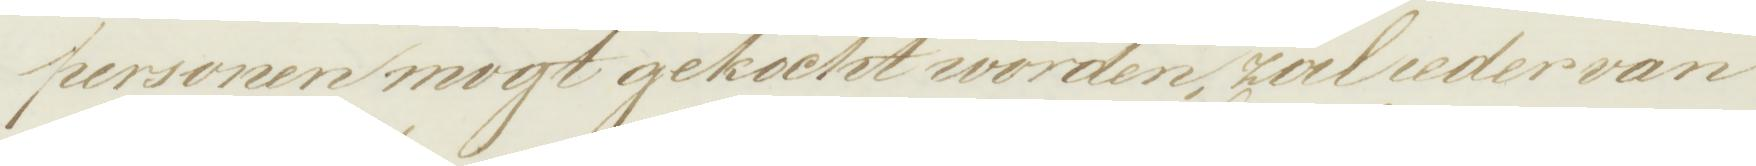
personen mogt gekocht worden, zal ieder van
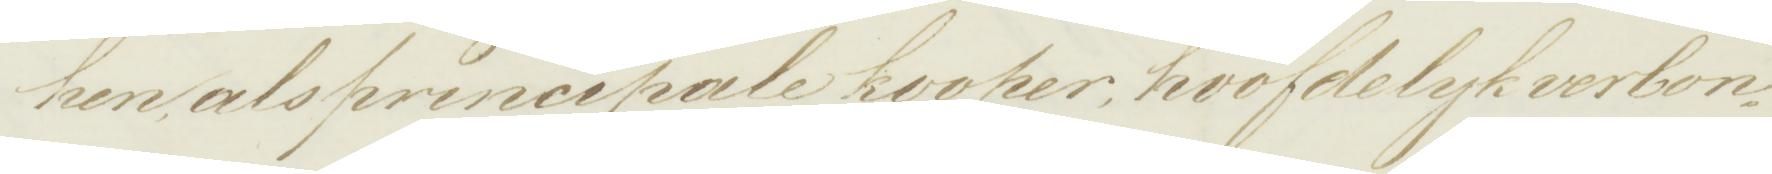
hen, als principale kooper, hoofdelyk verbon„
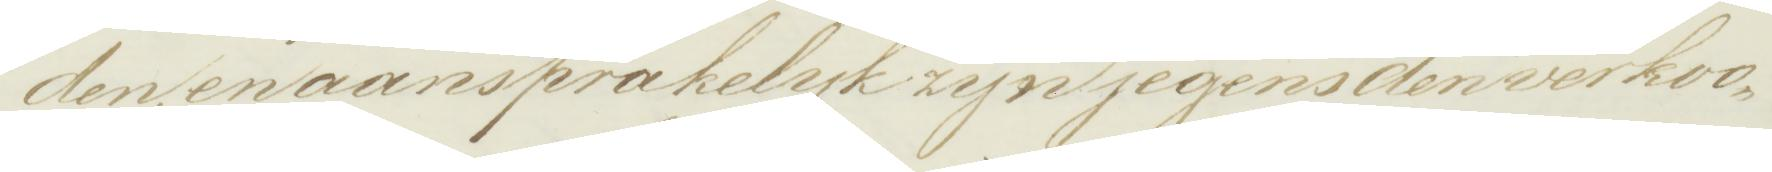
den, en aansprakelyk zyn jegens den verkoo„
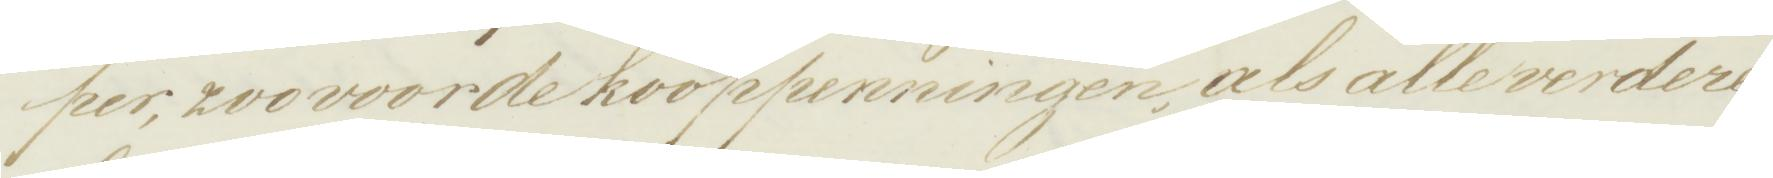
per, zoo voor de kooppenningen, als alle verdere
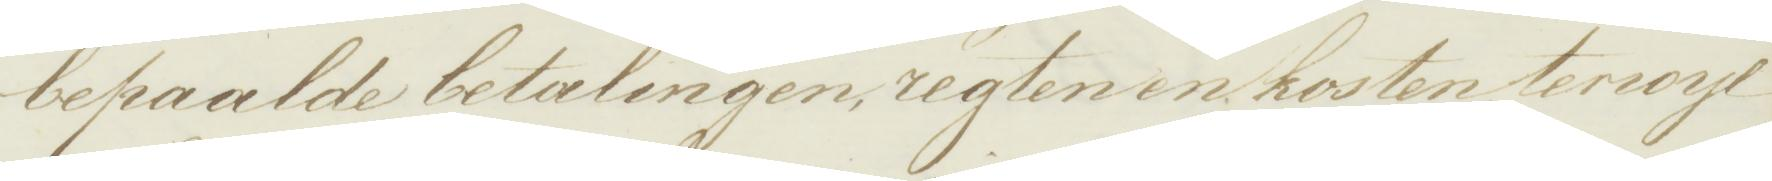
bepaalde betalingen, regten en kosten, terwyl
